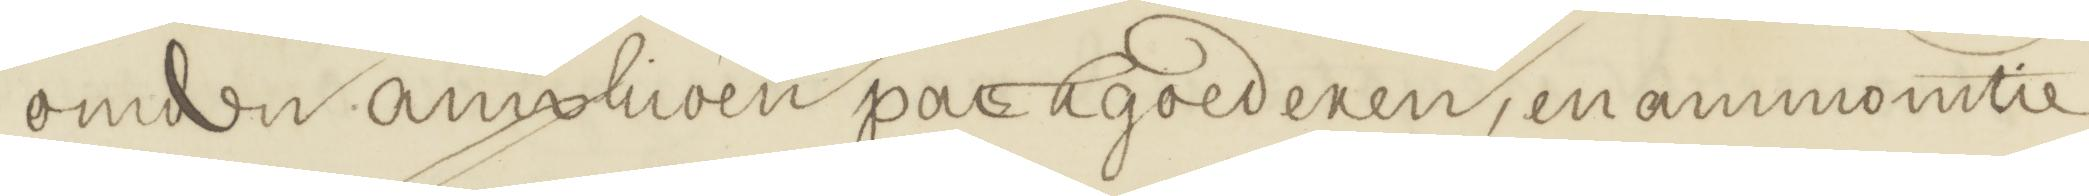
omden amphioen packgoederen, en ammonitie
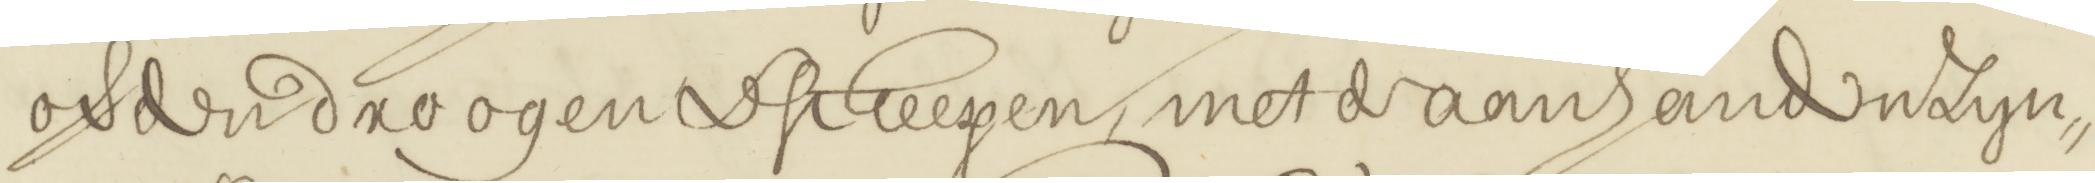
over den droogen te scheepen met de aanhanden Zyn„
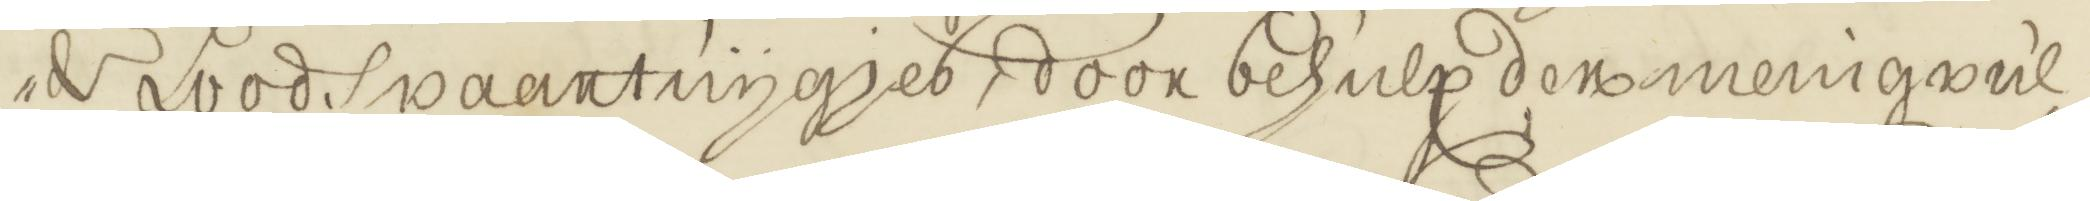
„de Loodsvaartuijgjes, door behulp der menigvul
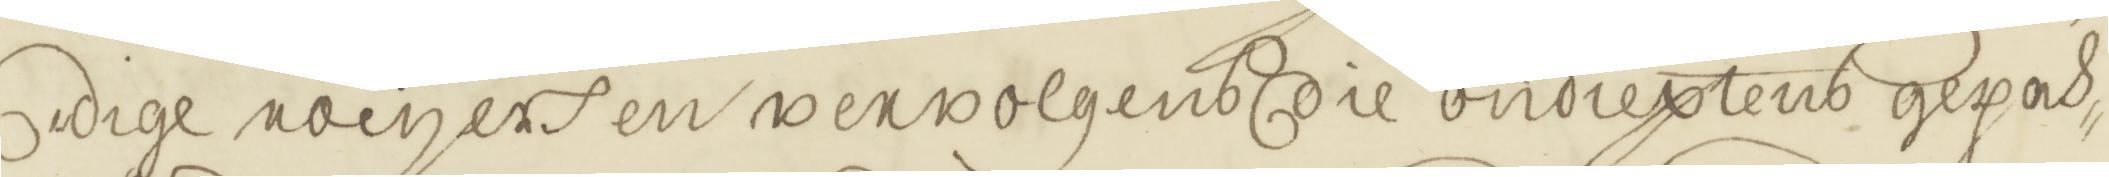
dige roeijers en vervolgens die ondieptens gepas„
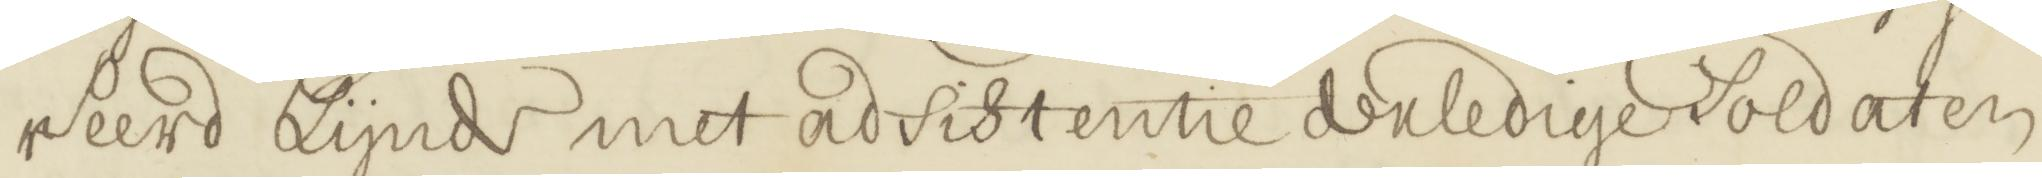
„seerd Zijnde met adsistentie der ledige Soldaten
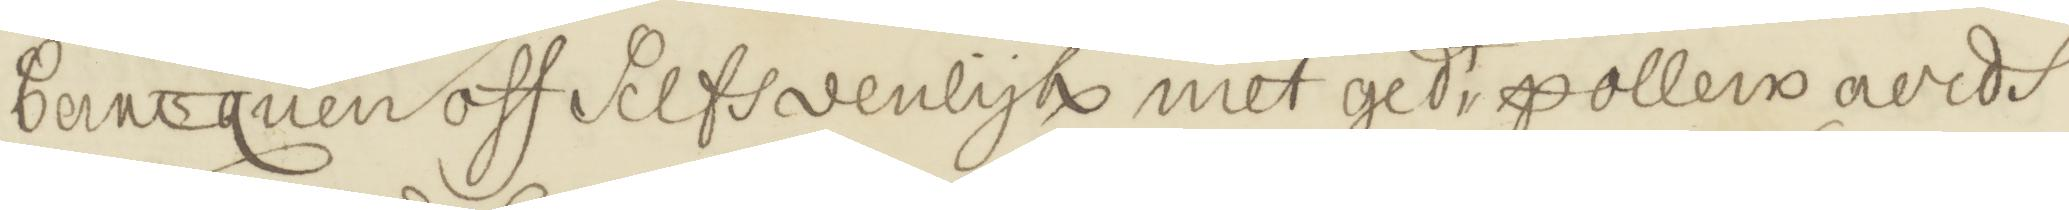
barcquen off Selfs eenlijk met ged„t pollewaerds
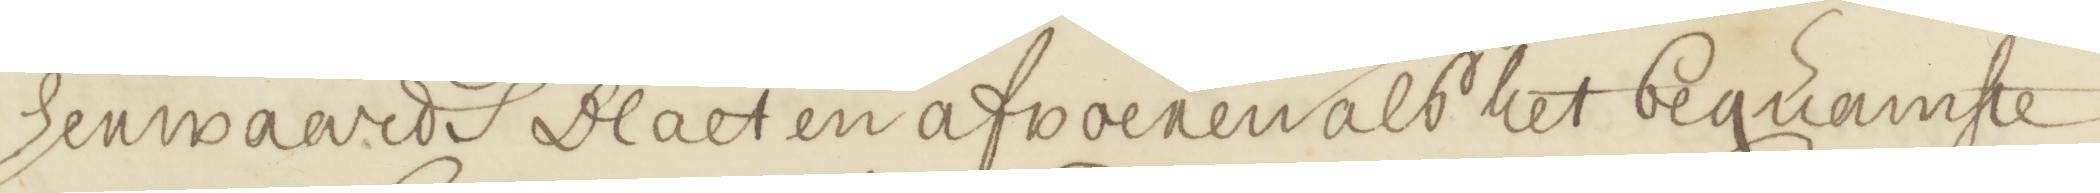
herwaards te laeten afvoeren als het bequamste
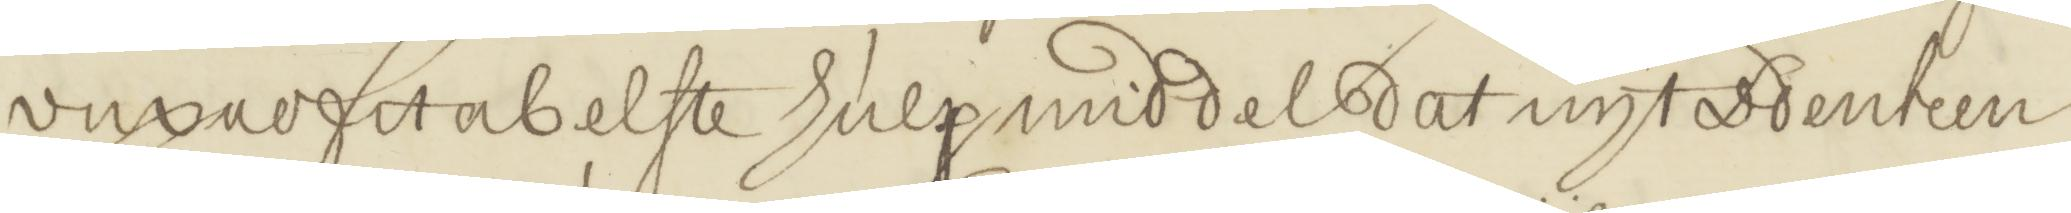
en profitabelste hulpmiddel dat uyt tedenken
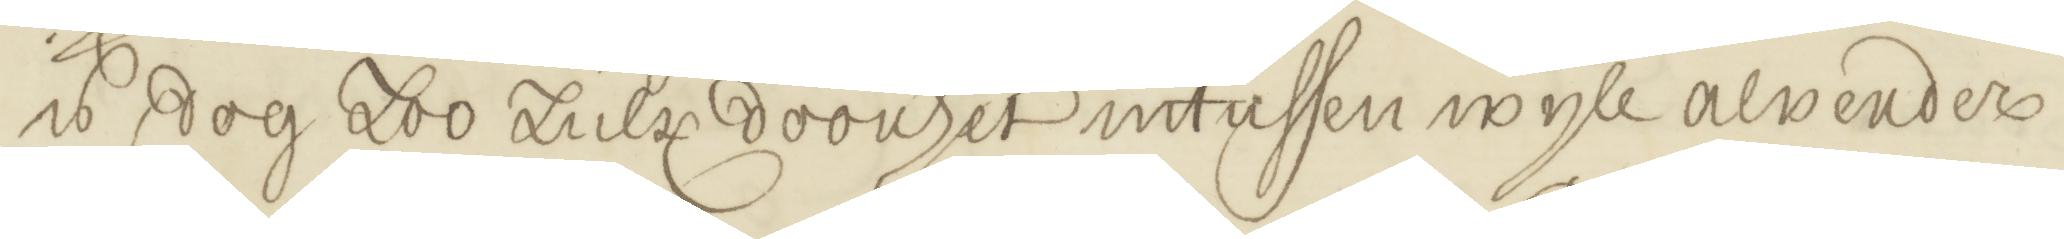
is dog Zoo Zulx door het intussen wijle alverder
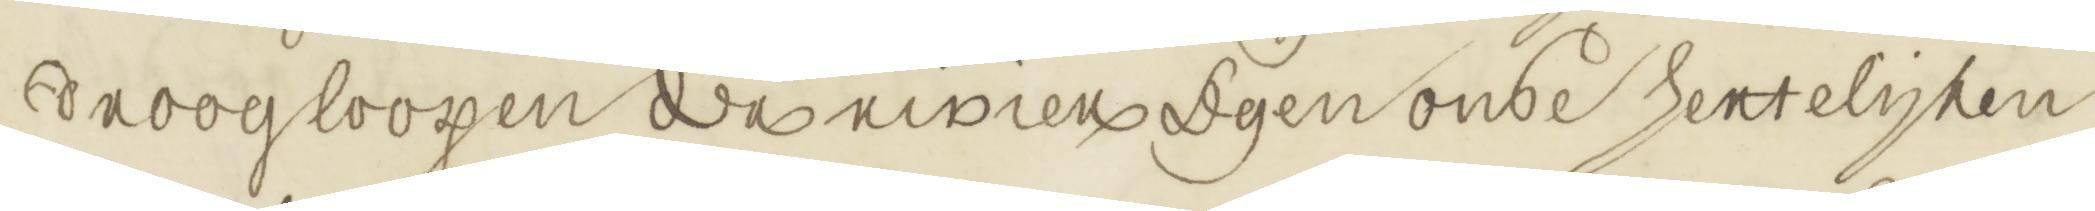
droogloopen der rivier tegen onse hertelijken
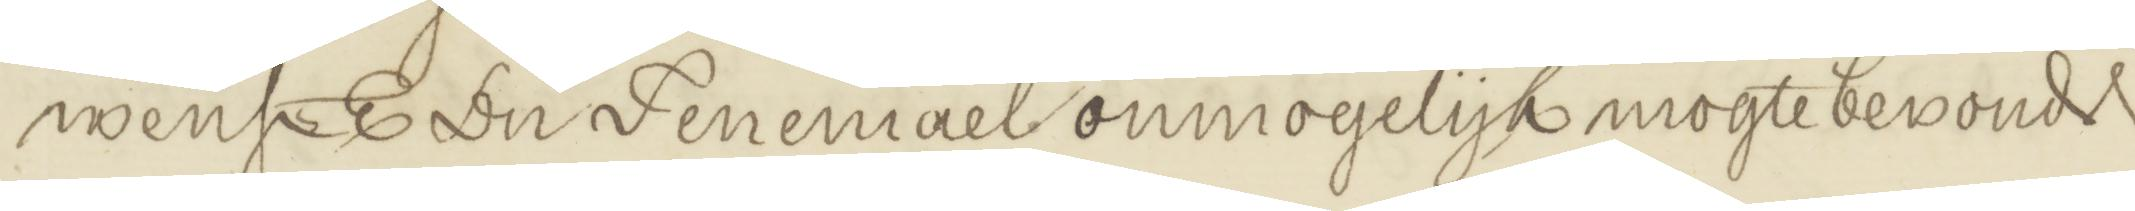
wensch ten Eenemael onmogelijk mogte bevonde
